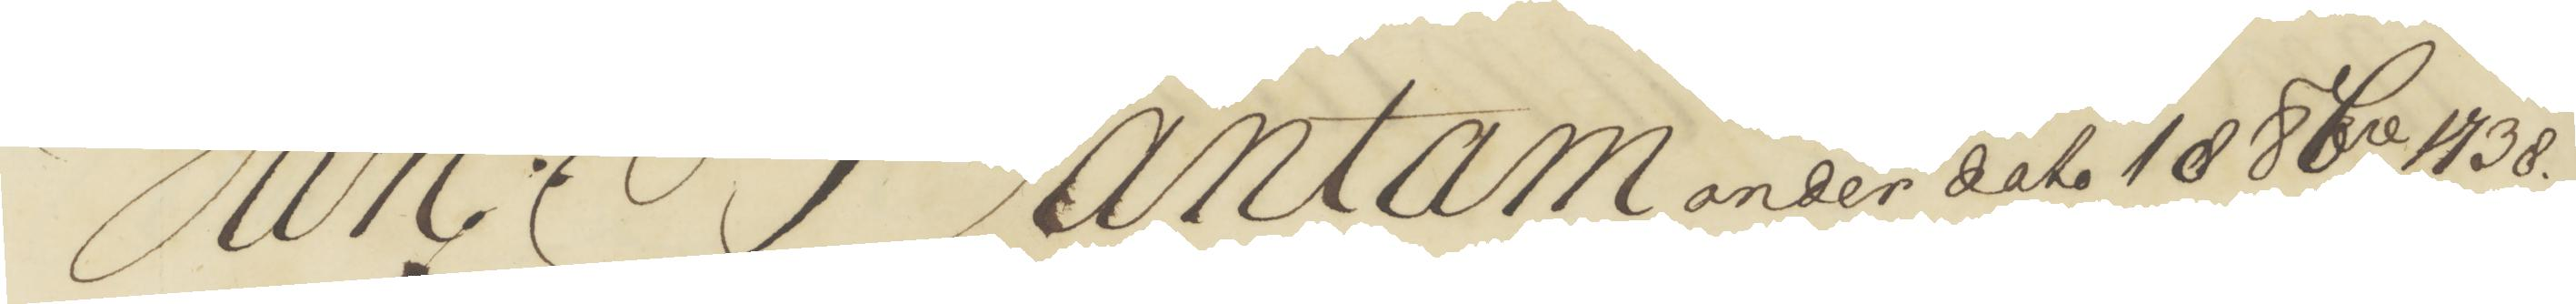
Van Bantam onder dato 18 8b:e 1738.
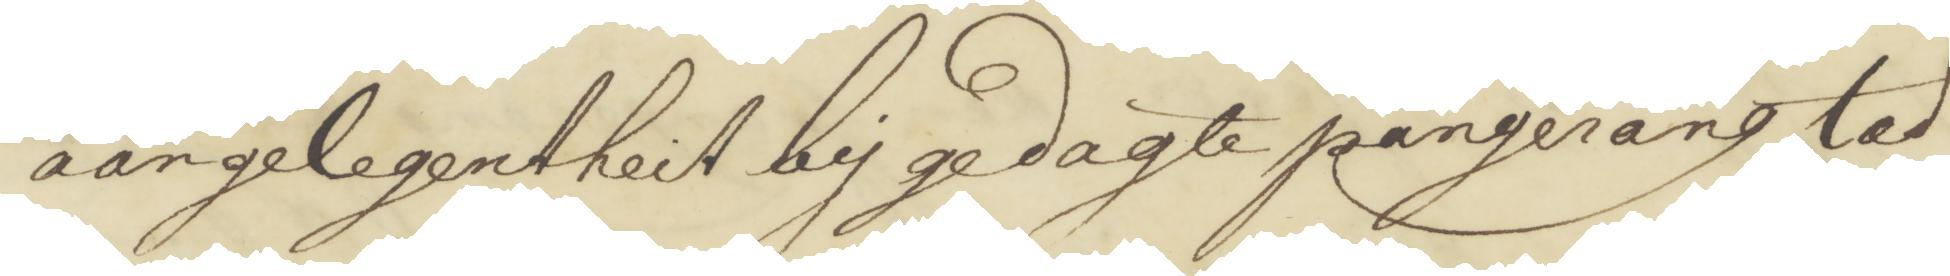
aangelegentheit bij gedagte pangerang tod
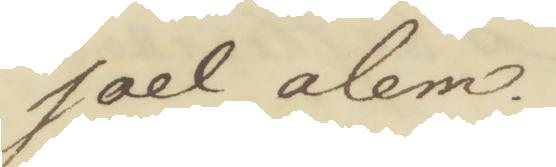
joel alem.
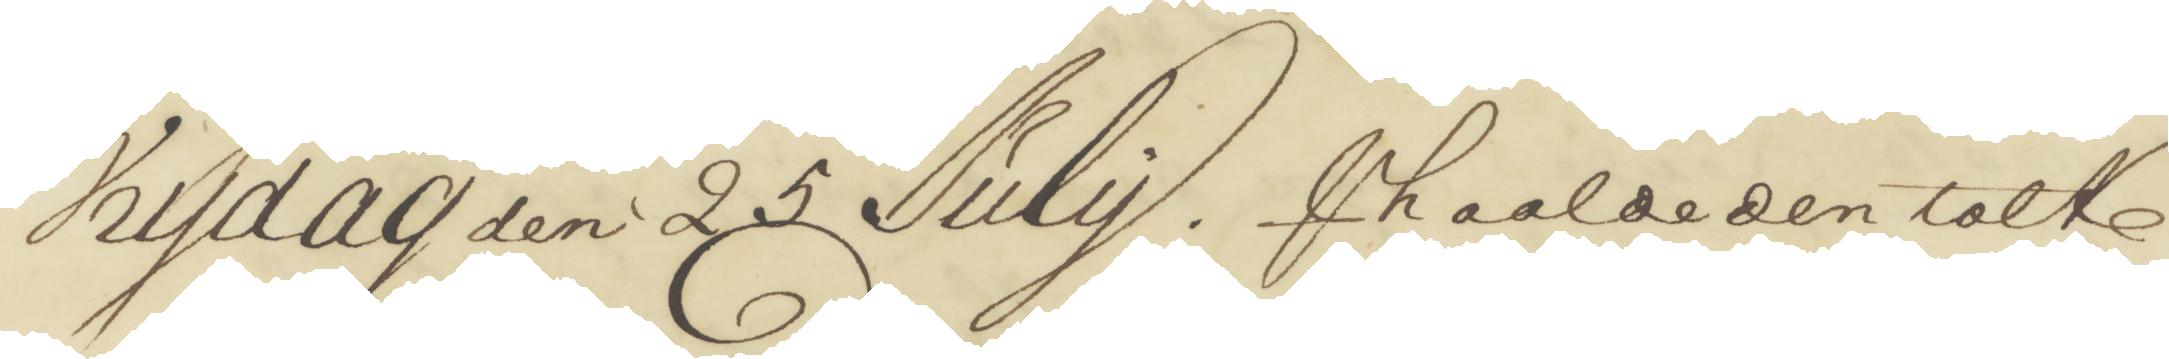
Vrijdag den 25 Julij. Verhaalde den tolk
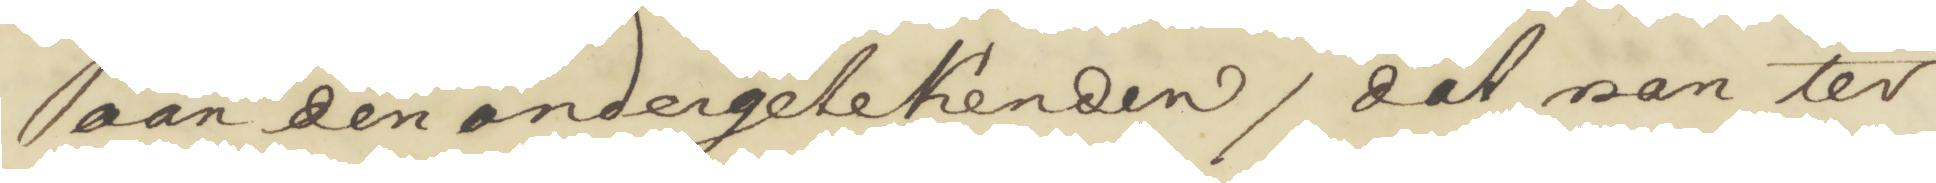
aan den ondergetekenden, dat van ter
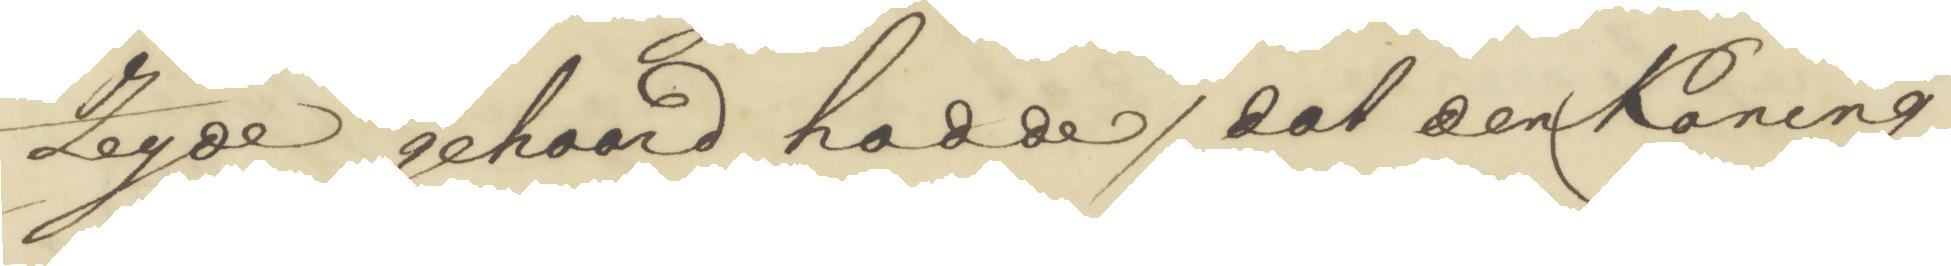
Zeijde gehoord hadde, dat den Koning
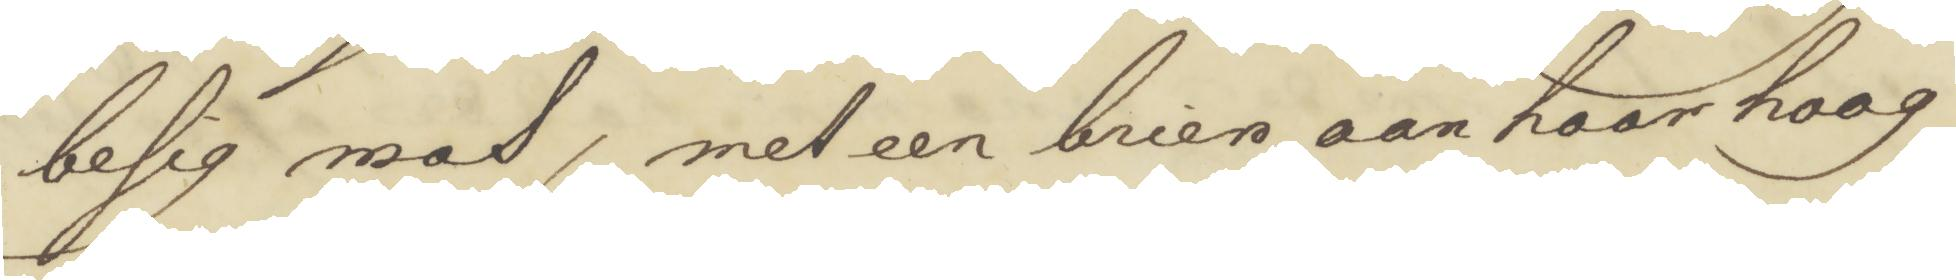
besig was, met een briev aan haar hoog
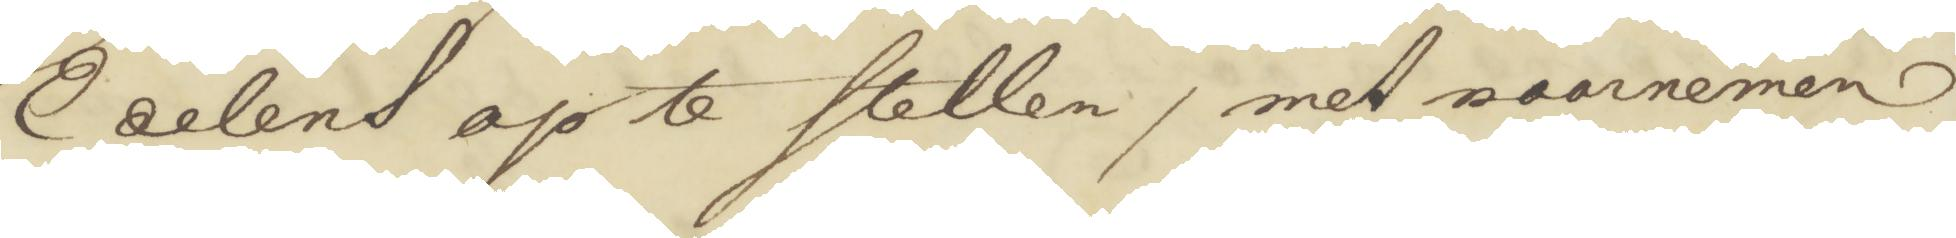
Edelens op te stellen, met voornemen
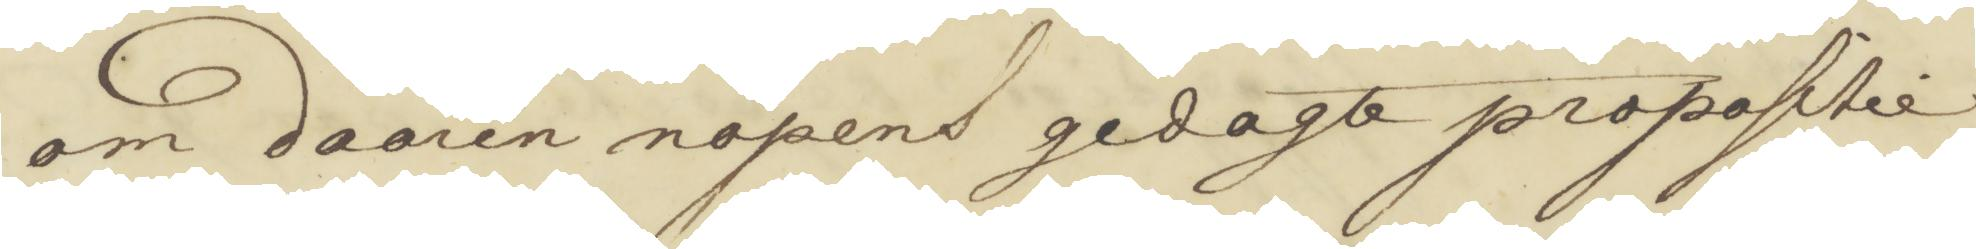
om daarin nopens gedagte propositie
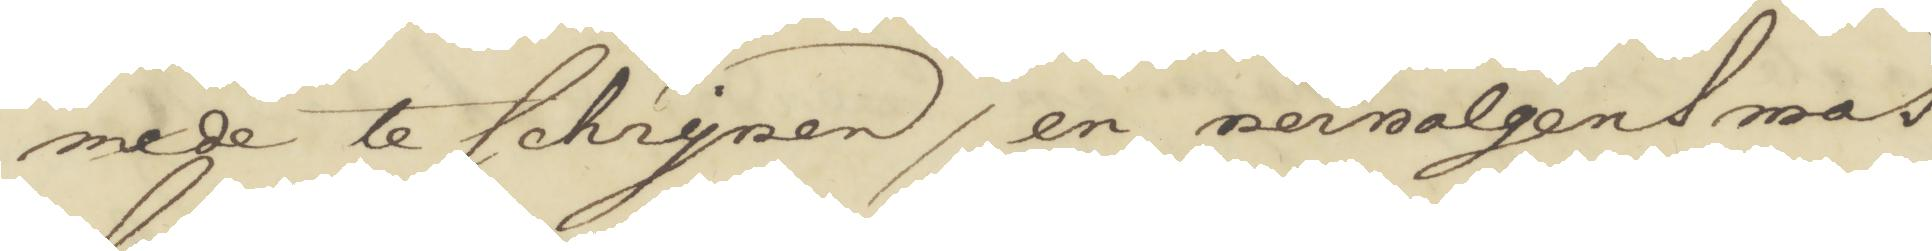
mede te schrijven, en vervolgens was
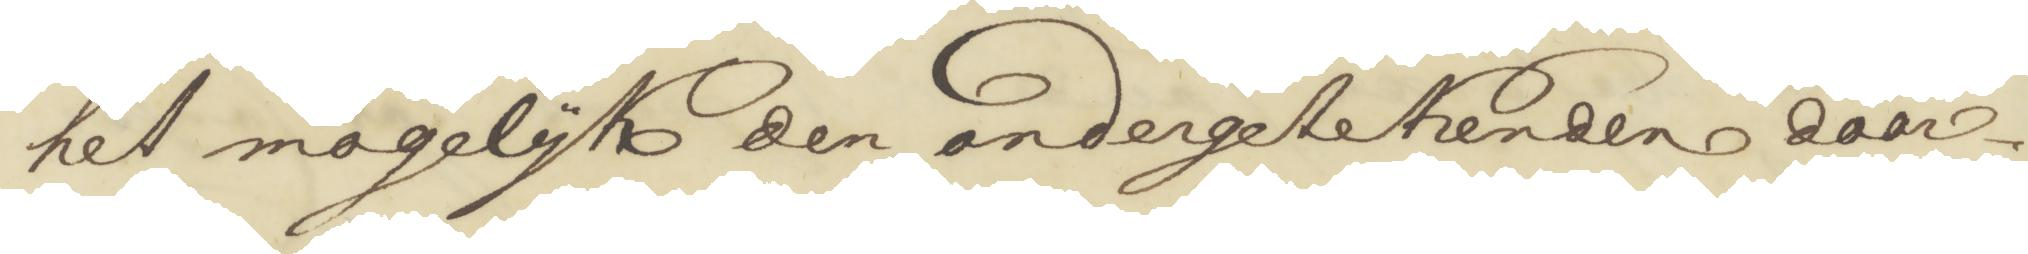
het mogelijk den ondergetekenden daar
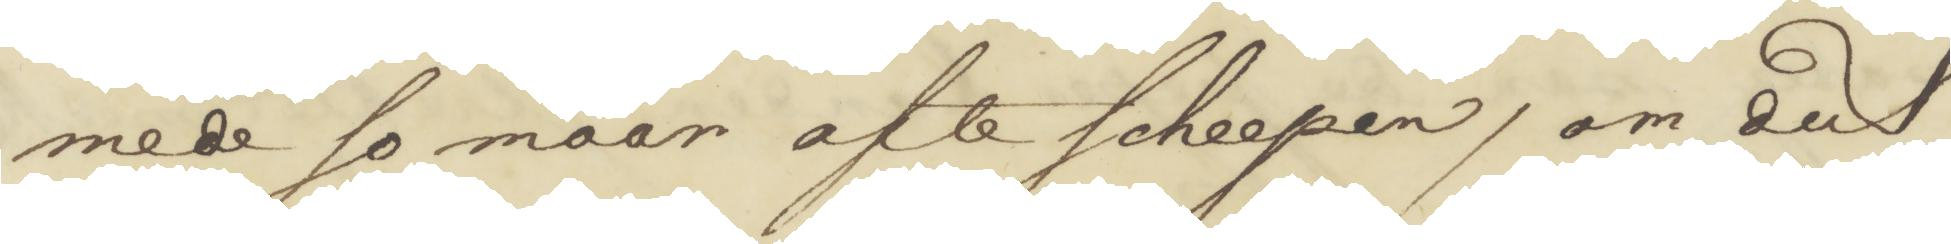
mede So maar afte Scheepen, om dus
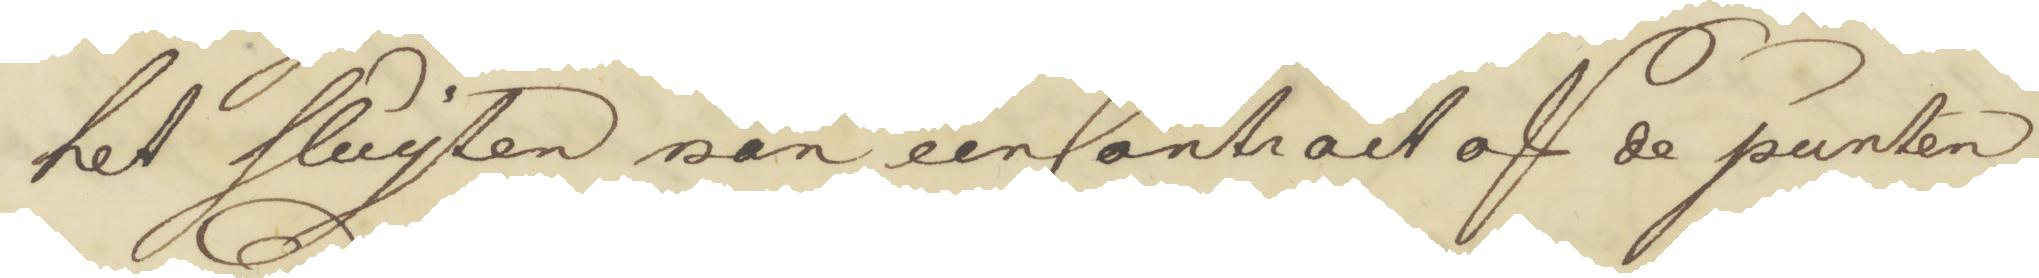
het Sluijten van een Contract of de punten
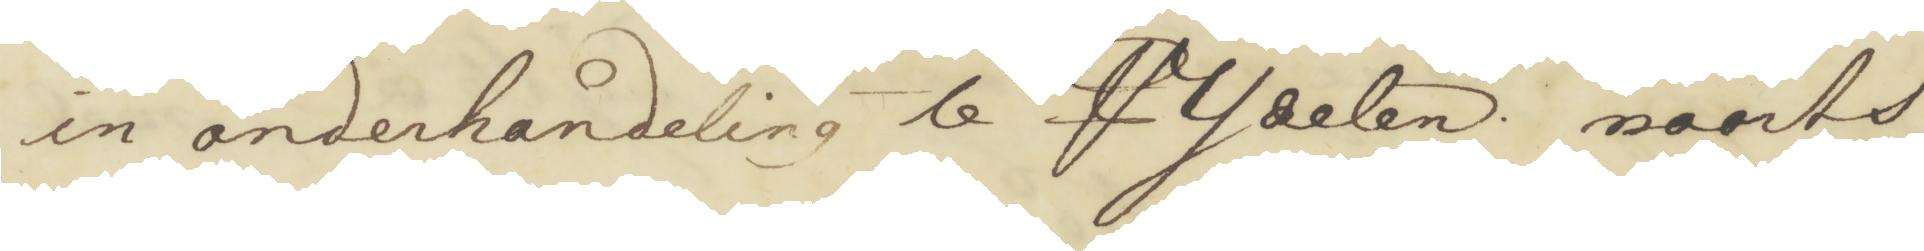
in onderhandeling te Verijdelen. voorts
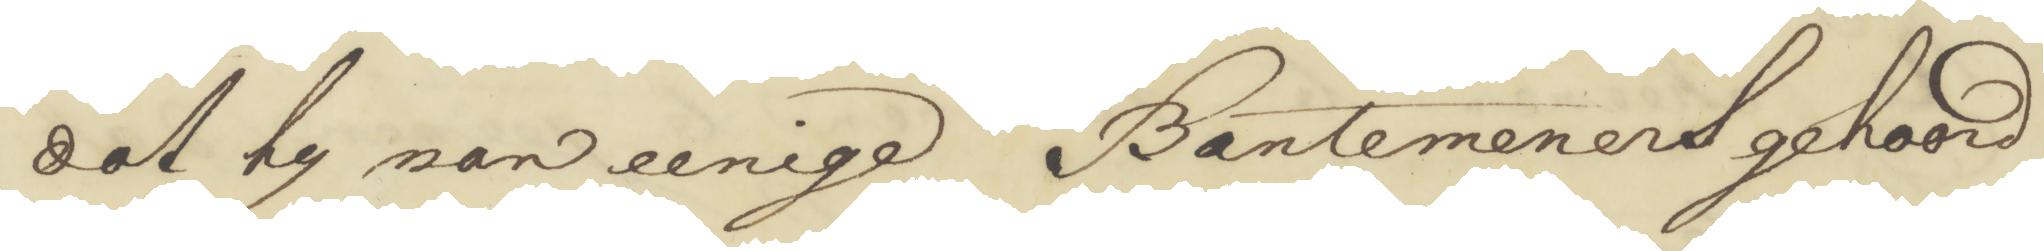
dat hy van eenige Bantemeners gehoord
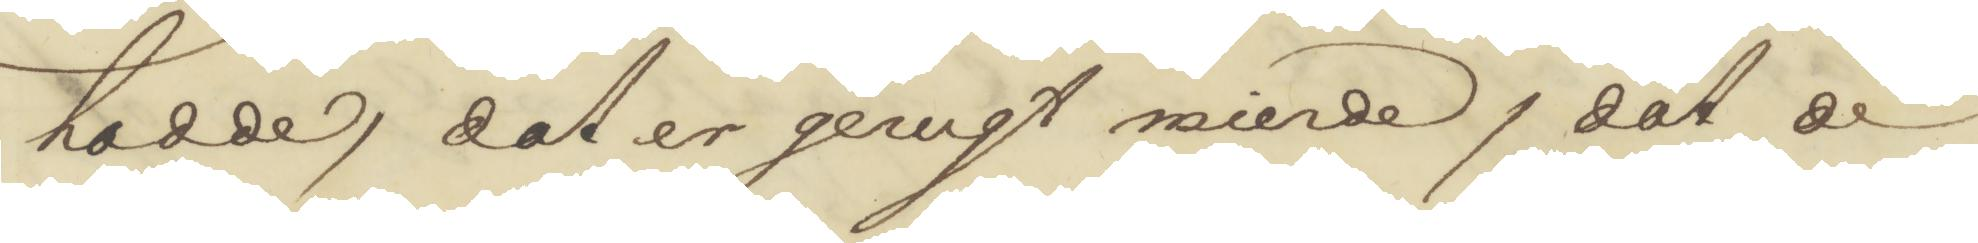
hadde, dat er gerugt wierde, dat de
